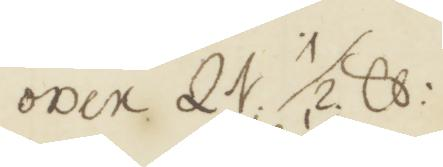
over 21. ½. lb:
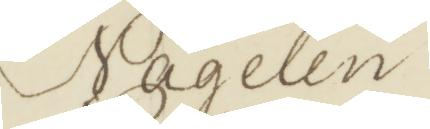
Nagelen
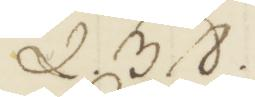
2.3.8.
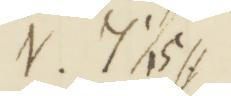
1. 7 1/15 „
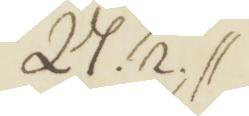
27. ½. „
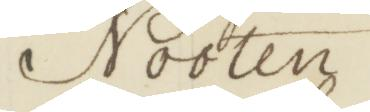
Nooten
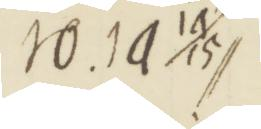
10.14 14/15
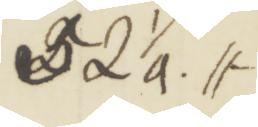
52 ¼. „
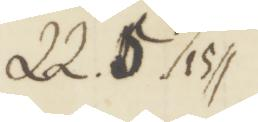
22.5 . 13/15 „
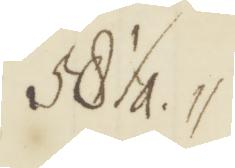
58 ¼. „
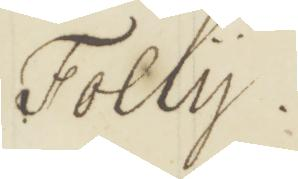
Follij.
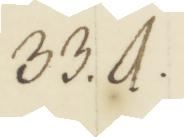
33:4.
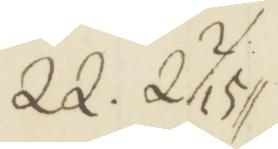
22. 2 2/15 „
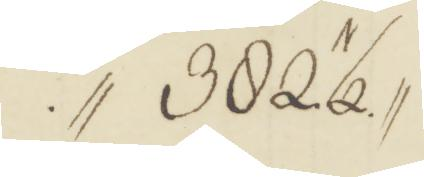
„ 382 ½ . „
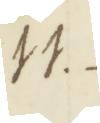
3. 11.
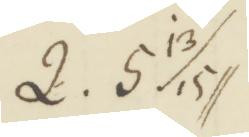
2.5 13/15
